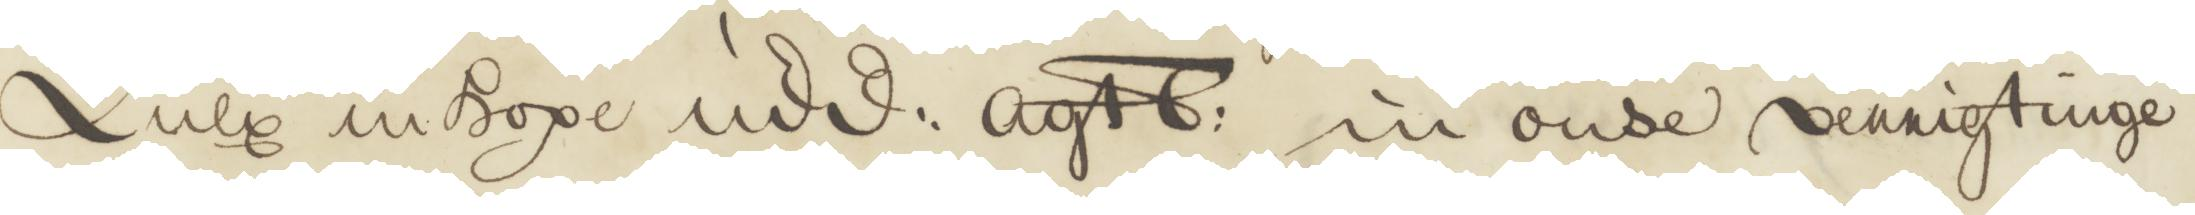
Zulx in hope uEE: agtb: in onse verrigtinge
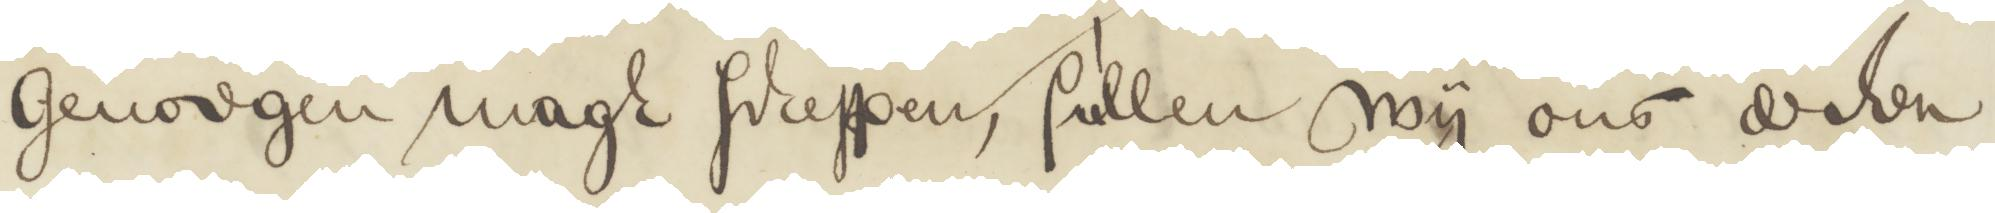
genoegen magh scheppen, sullen wij ons de Eer
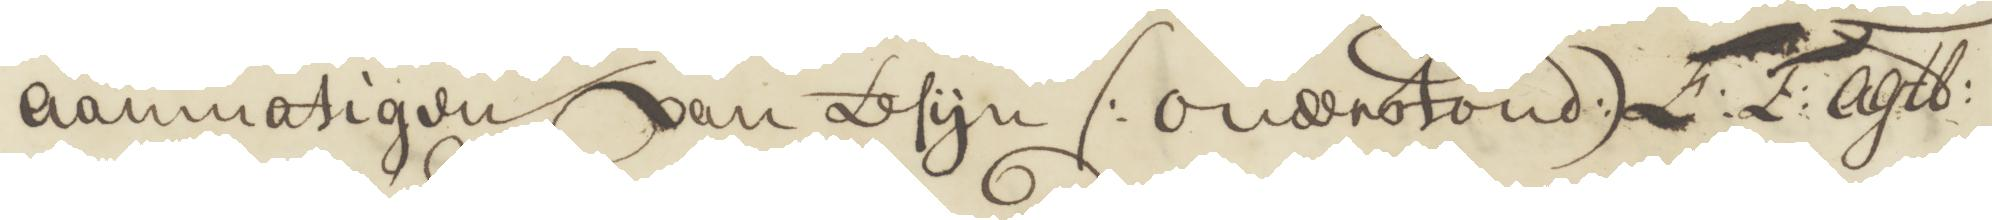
aanmatigen van te sijn (:onderstond:) E: E: agtb:
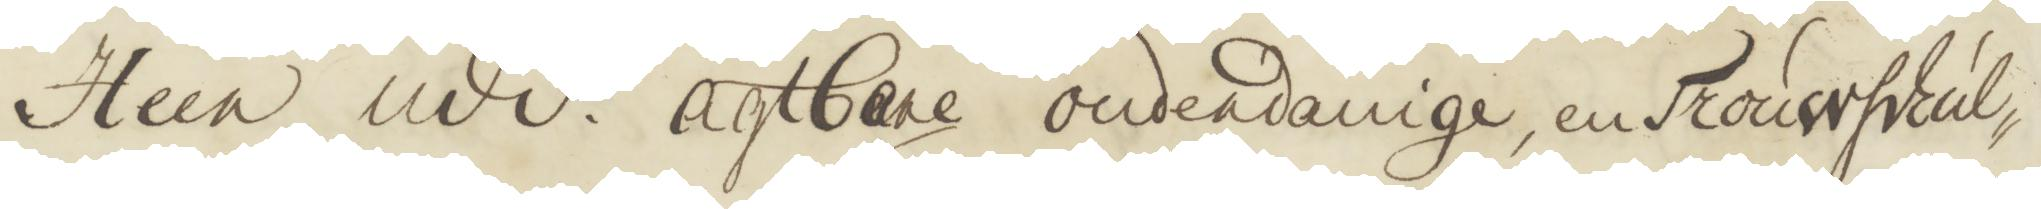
Heer, u EE. agtbare onderdanige, en Trouwschul„
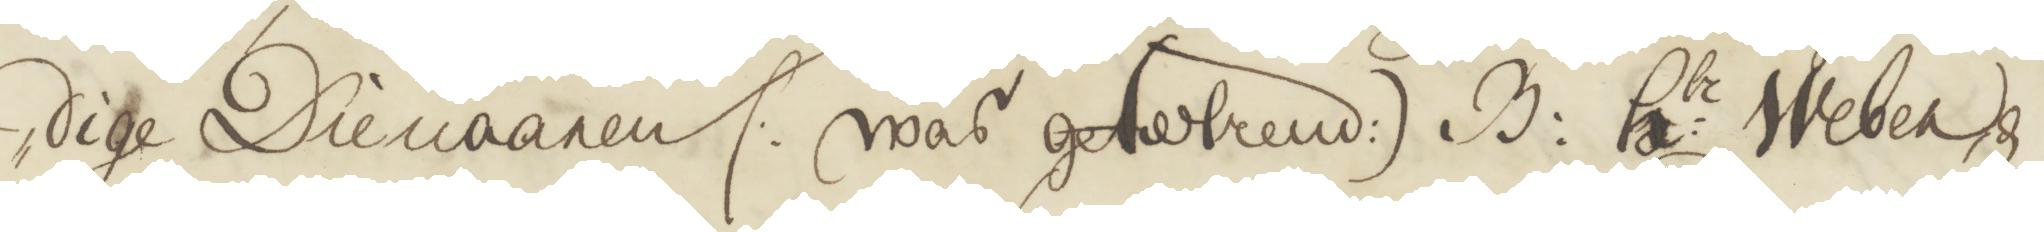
„dige Dienaaren (:was geteekend:) B: h:k Weber, &
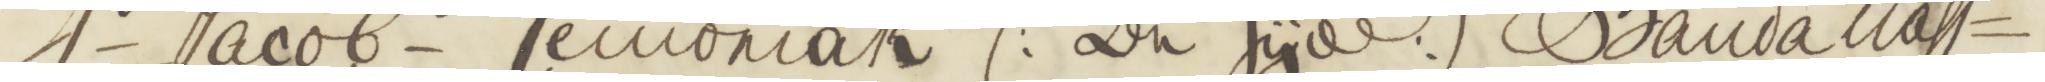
J-s Jacob=s Semoriak (:ter sijde:) Banda nass=w
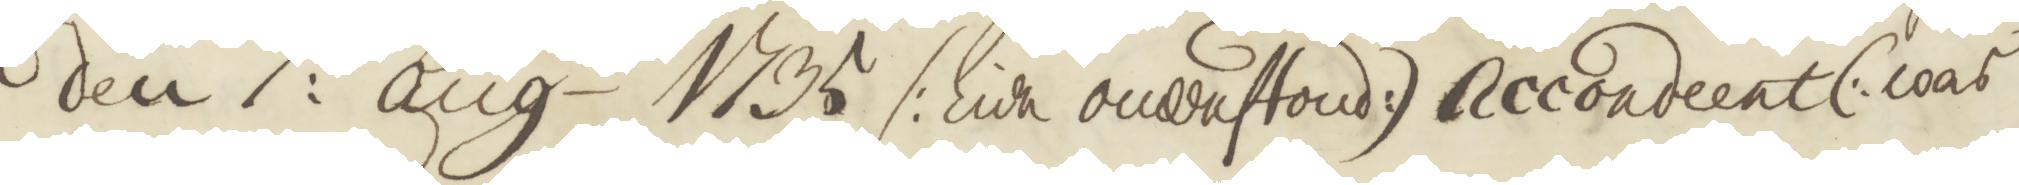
den 7: aug-o 1735 (:hier onderstond:) Accordeert (:was
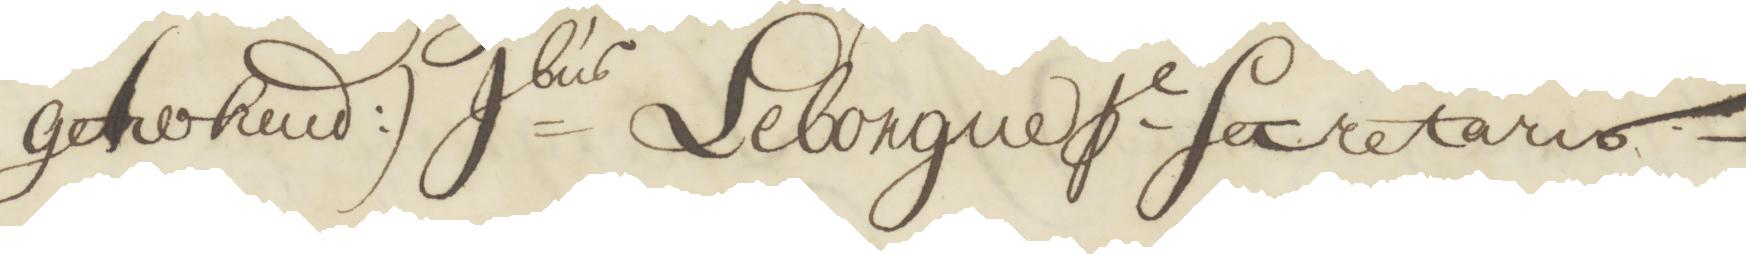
geteekend:) J=bus Leborgue p-l Secretaris.
